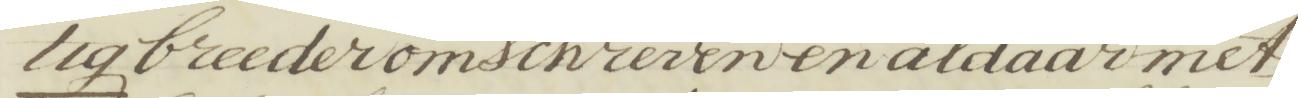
tig breeder omschreven en aldaar met
